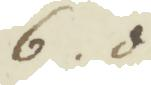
6. d
